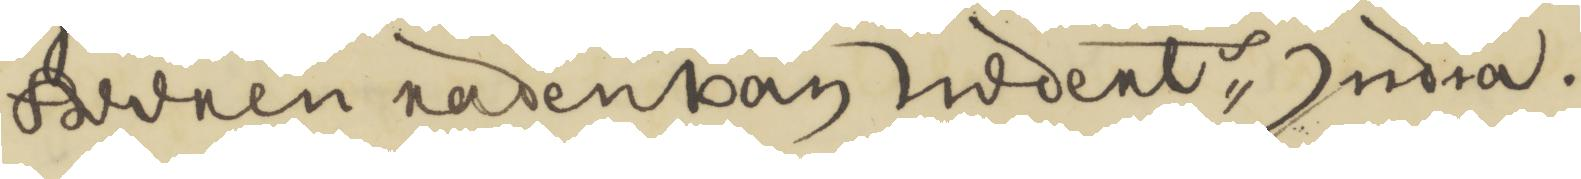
Heeren raden van nedert„s India.
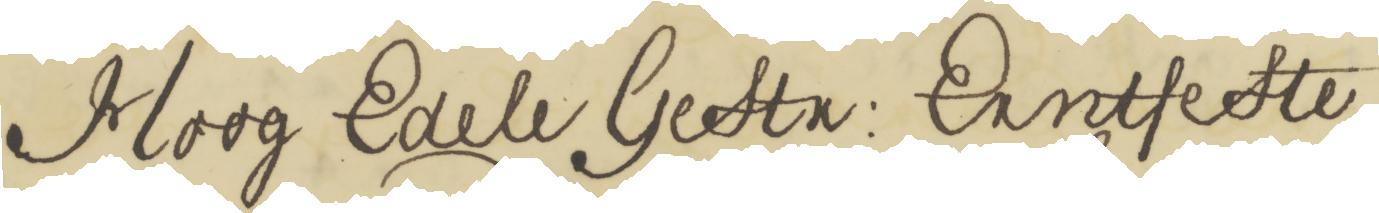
Hoog Edele Gestr: Erntfeste
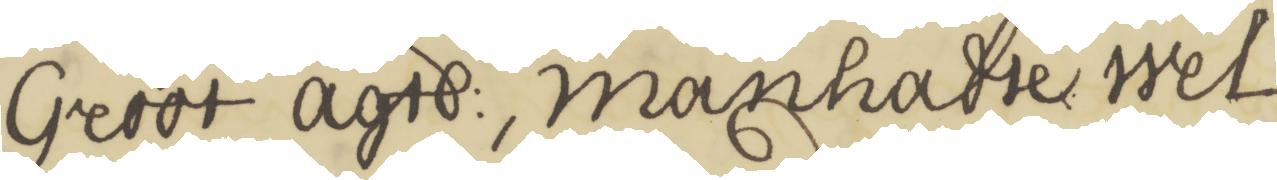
Groot Agtb:, manhafte wel
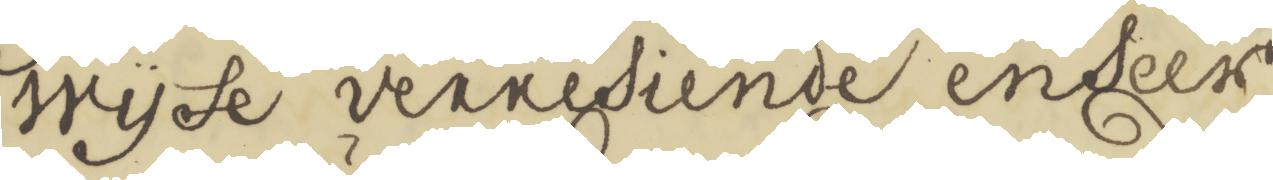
Wijse verresiende en seer
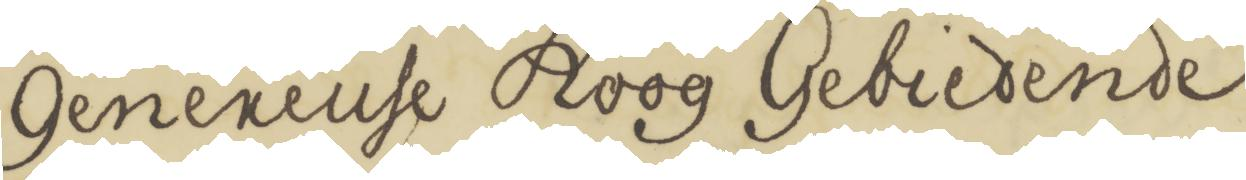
genereuse Hoog Gebiedende
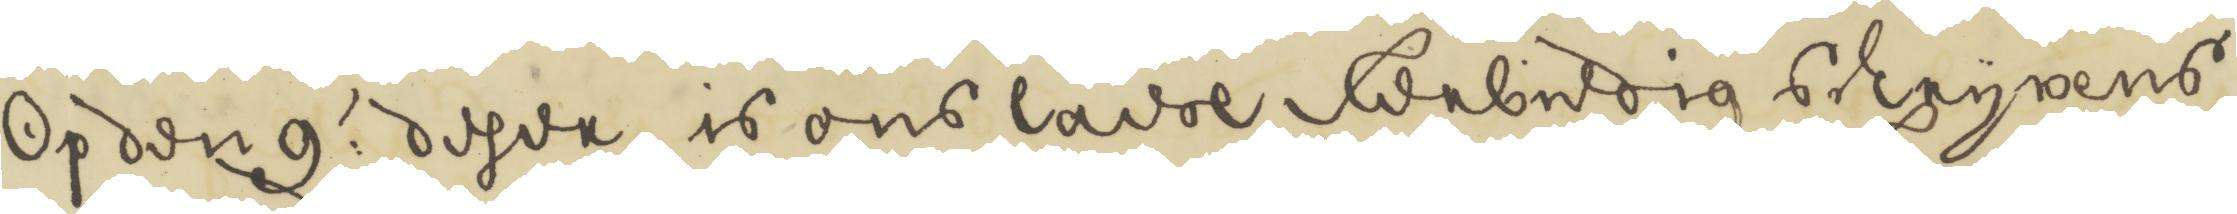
Op den 9:' deser, is ons laest Eerbiedig schrijvens
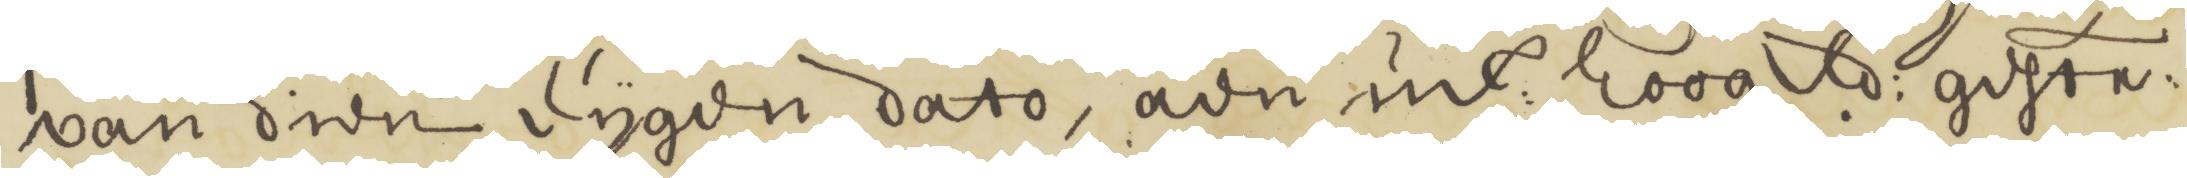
van dien Eijgen dato, aen uE: hoog Ed: gestr:
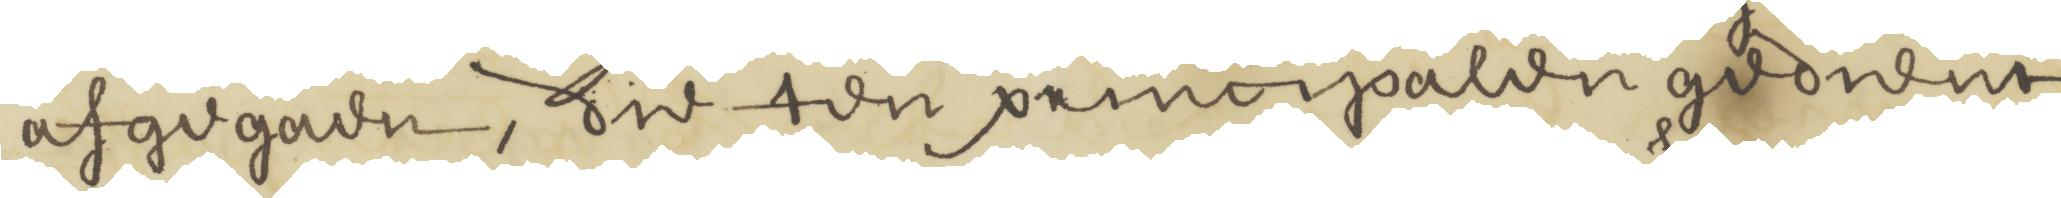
afgegaen, die ten principalen gedient
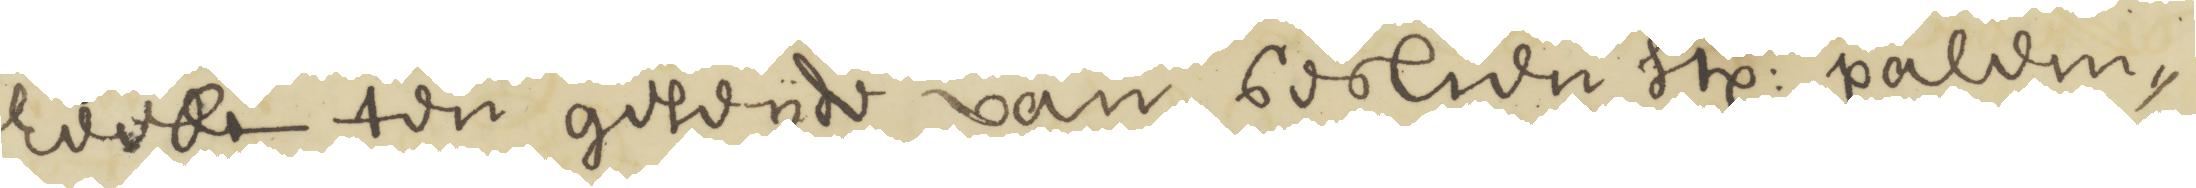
heeft ten geseijde van sestien stx: palem„
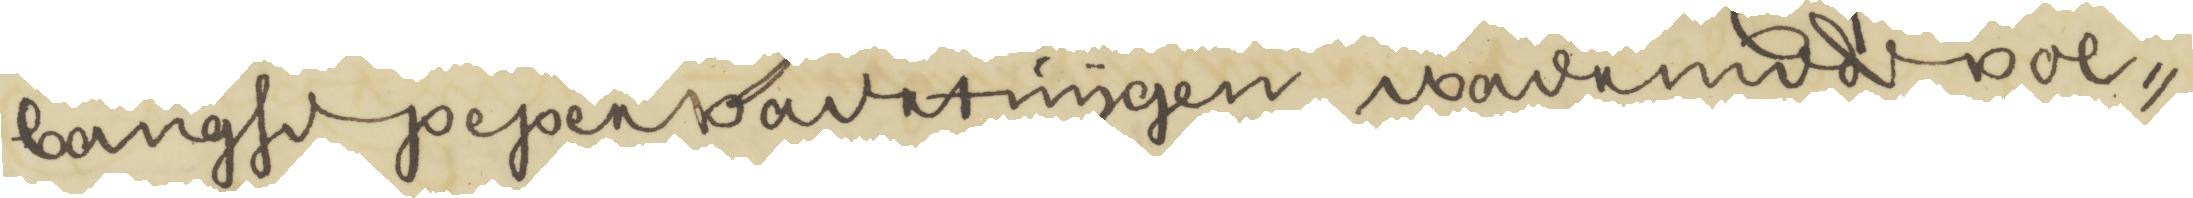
bangse pepervaertuijgen waermede vol„
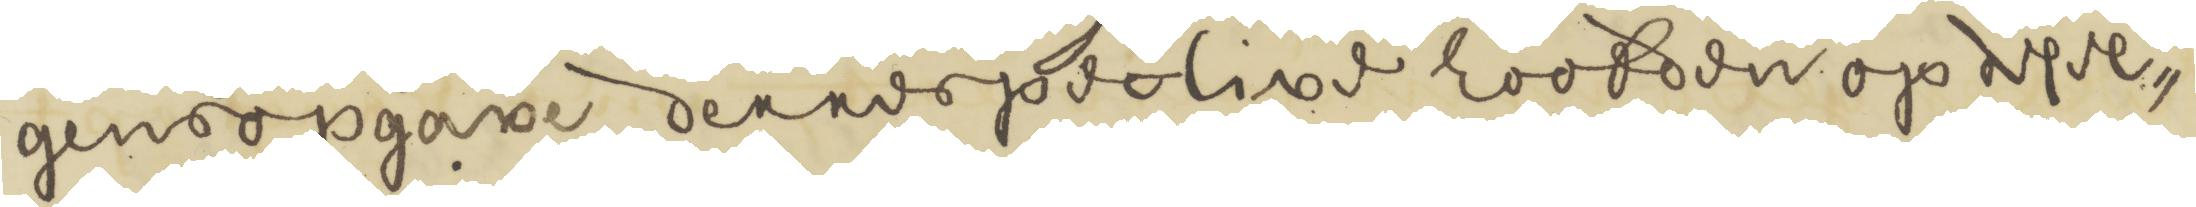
gens opgave der respective hoofden op desel„
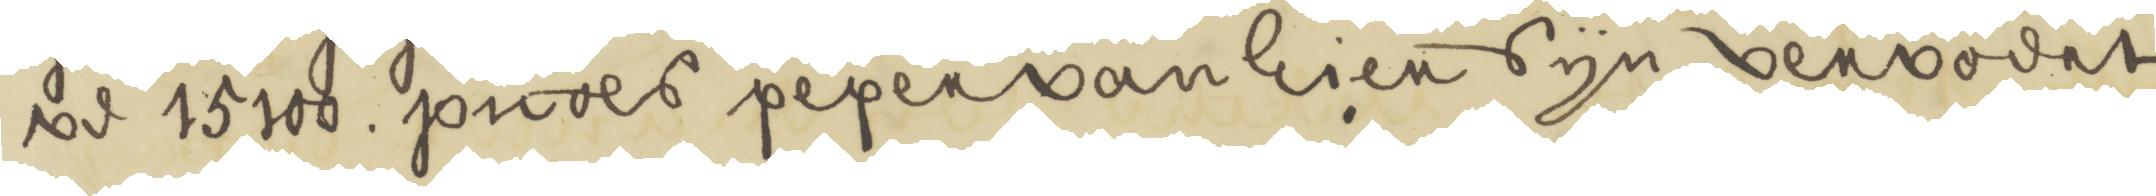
ve 15100. picols peper van hier sijn vervoert
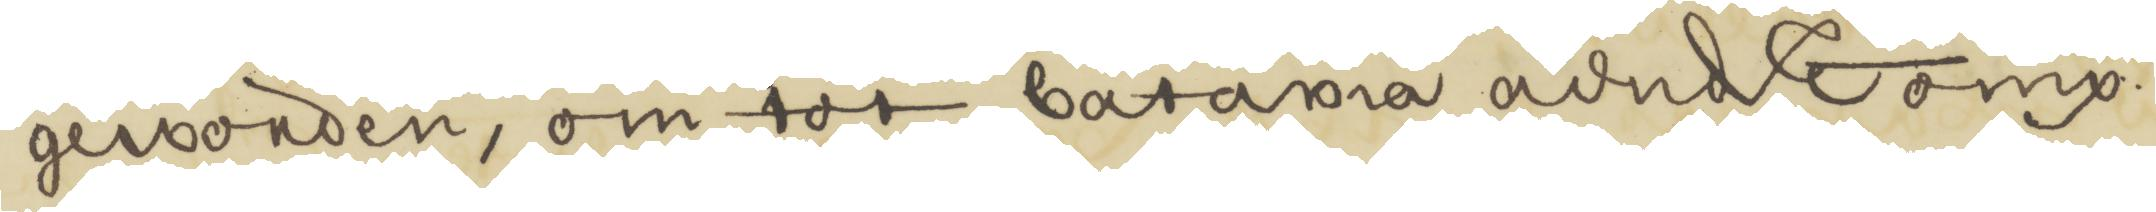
geworden, om tot batavia aende Comp:
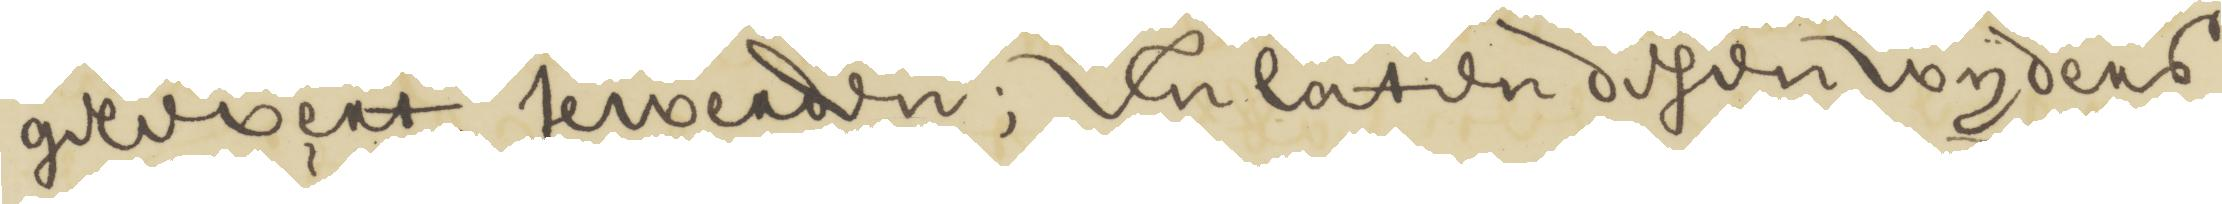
gelevert tewerden; En laten desen wijders
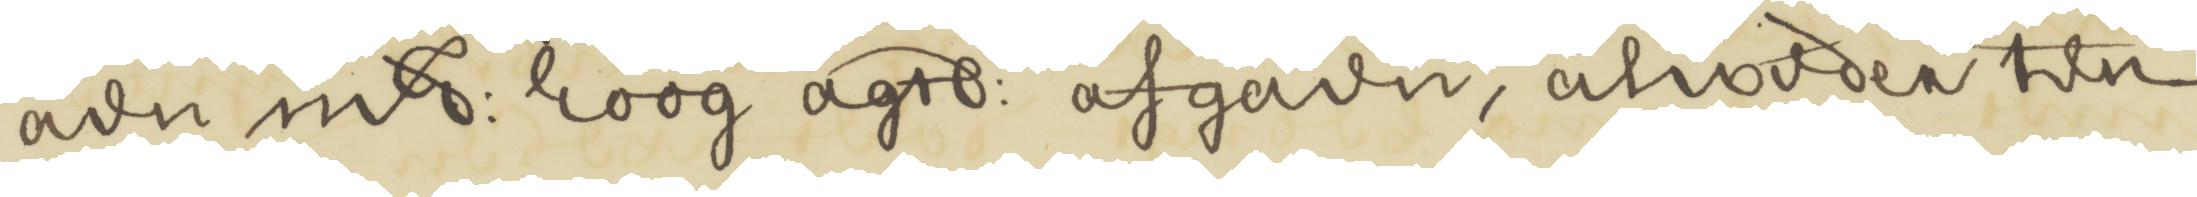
aen uEd: hoog agtb: afgaen, alweder ten
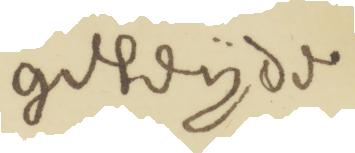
geseijde
